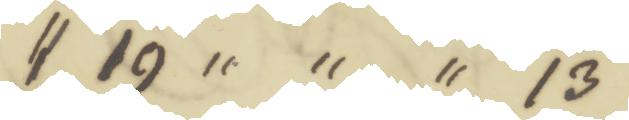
„ 19 „ „ „ 13
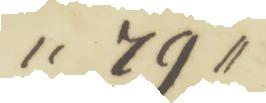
„ 79 „
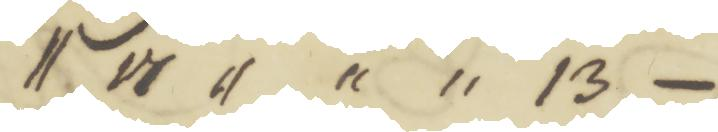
„ 17 „ „ „ 13. —
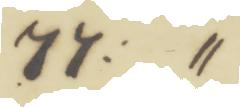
77: „
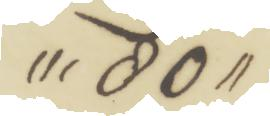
„ 80„
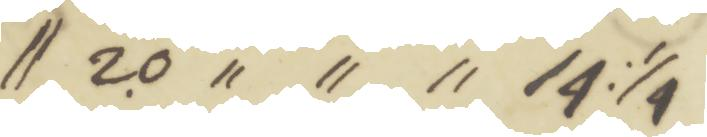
„ 20 „ „ „ 14.¼
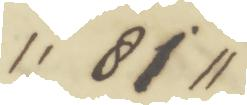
„ 81 „
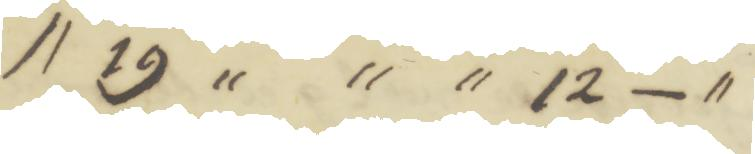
1 19 „ „ „ 12 — „
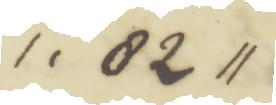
„ 82 „
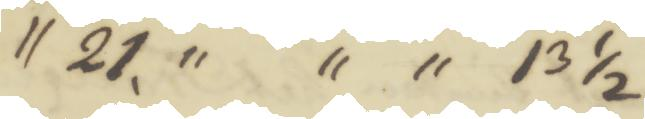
„ 21 „ „ „ 13½
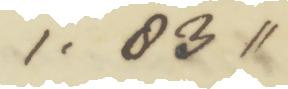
83 „
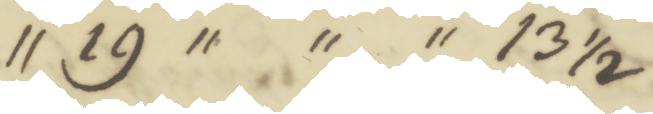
„ 19 „ „ „ 13½
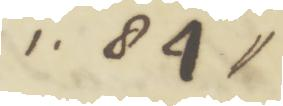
84 „
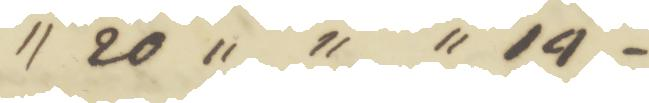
„ 20 „ „ „ 14 –
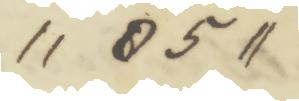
„ 85 „
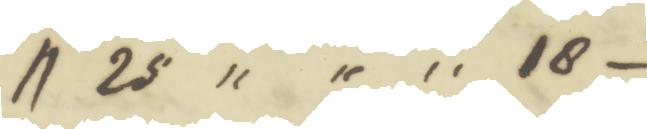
25 „ „ „ 18 —
